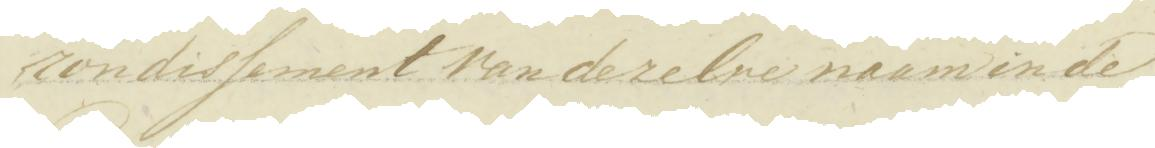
rondissement van dezelve naam in de
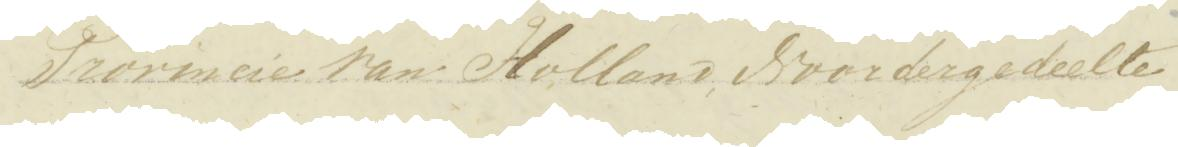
Provincie van Holland, Noordergedeelte
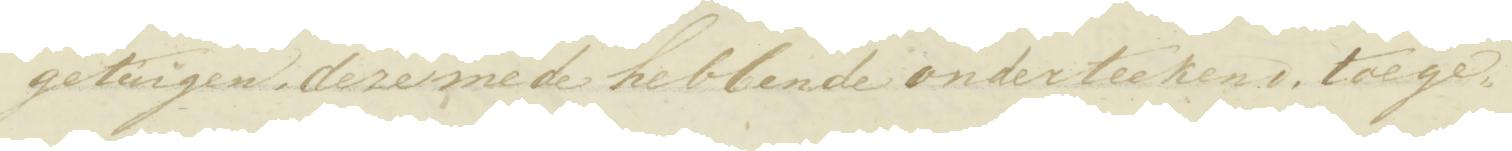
getuigen, deze mede hebbende onderteekend, toege„
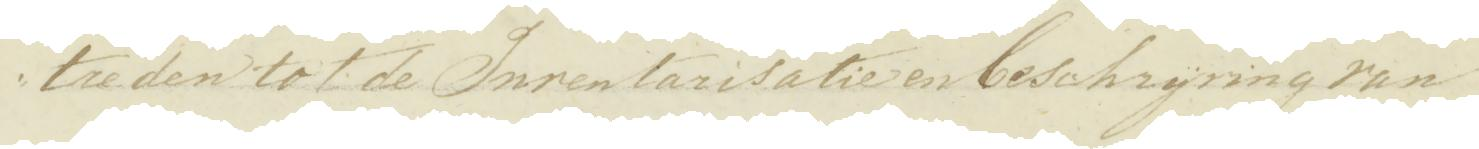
„treden tot de Jnventarisatie en beschrijving van
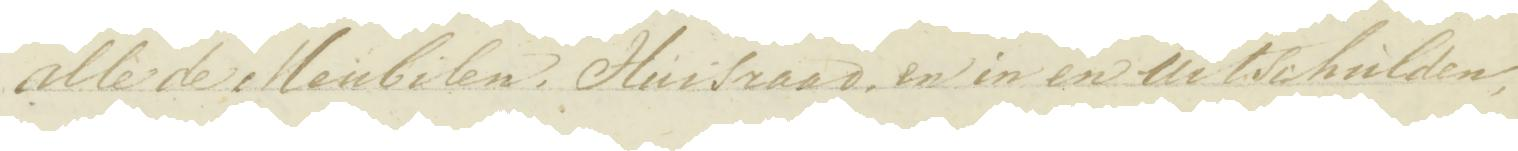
alle de Meubilen, Huisraad, en in en uitschulden,
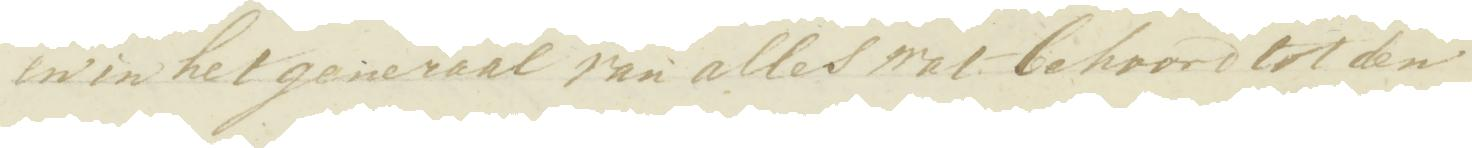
en in het generaal van alles wat behoord tot den
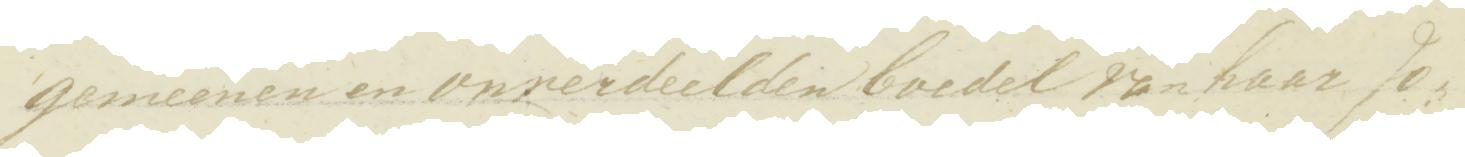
gemeenen en onverdeelden boedel van haar Jo„
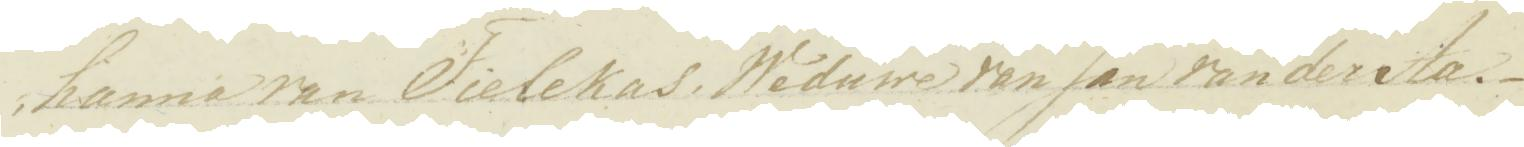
„hanna van Tielekas, Weduwe van Jan van der Aa.
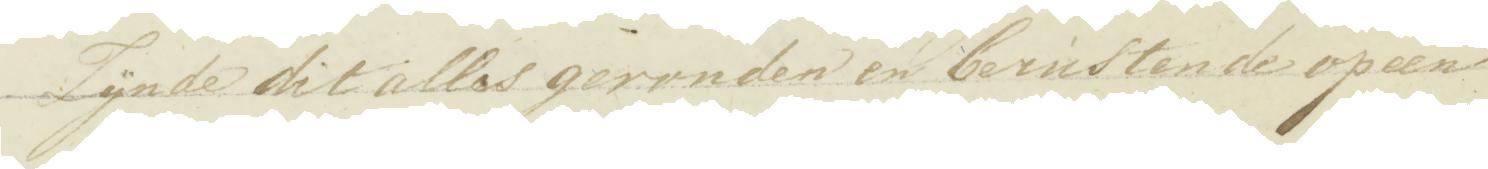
Zijnde dit alles gevonden en berustende op een
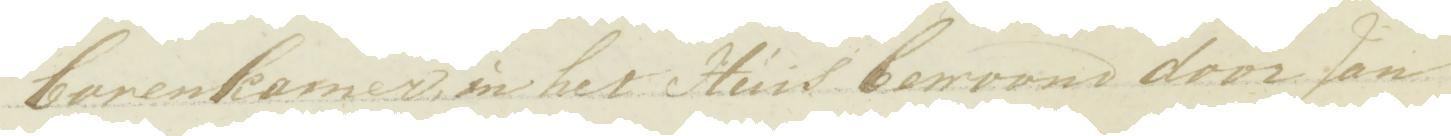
bovenkamer, in het Huis bewoond door Jan
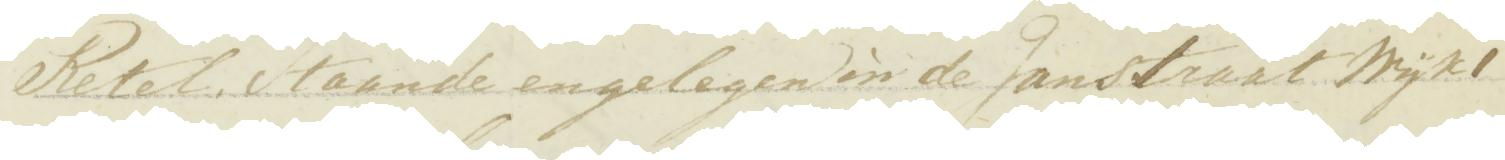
Ketel, staande en gelegen in de Janstraat Wijk 1
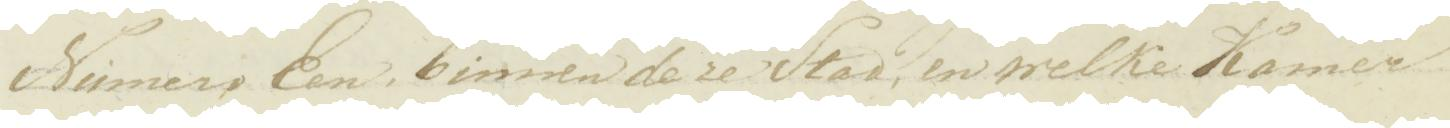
Numero Een, binnen deze stad, en welke Kamer
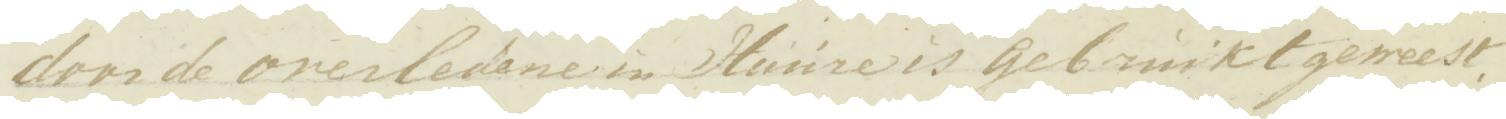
door de overledene in Huure is gebruikt geweest,
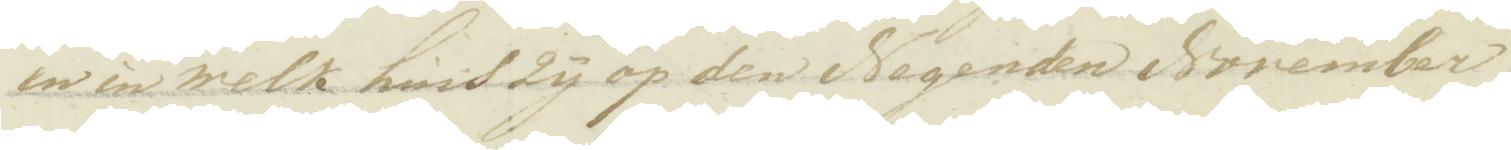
en in welk huis zij op den Negenden November
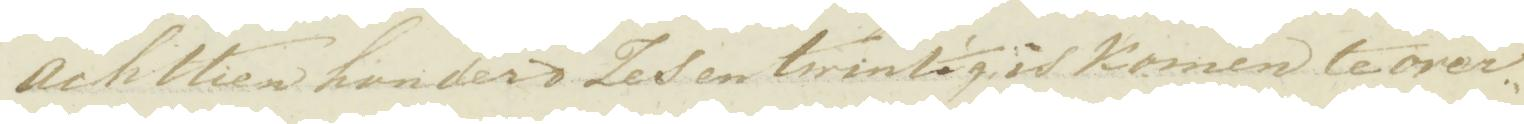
achttien honderd zes en twintig, is komen te over„
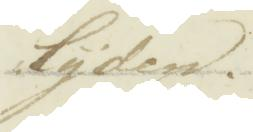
„lijden.
